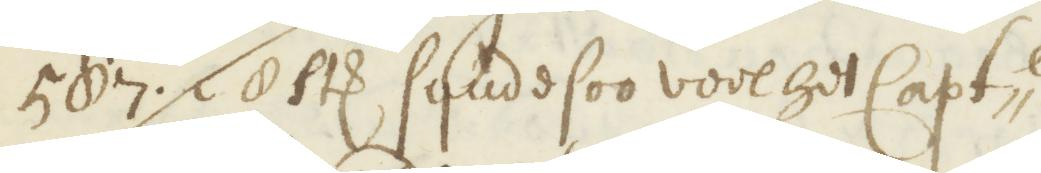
587. ƒ 8 stver synde soo veel het Capt„l
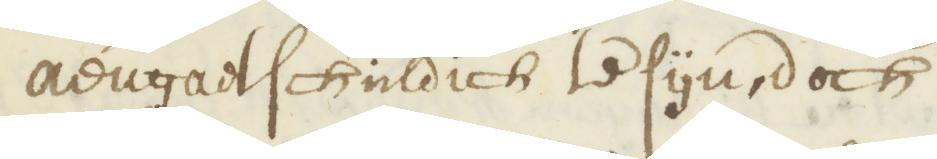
aengaet schuldich te sijn, doch
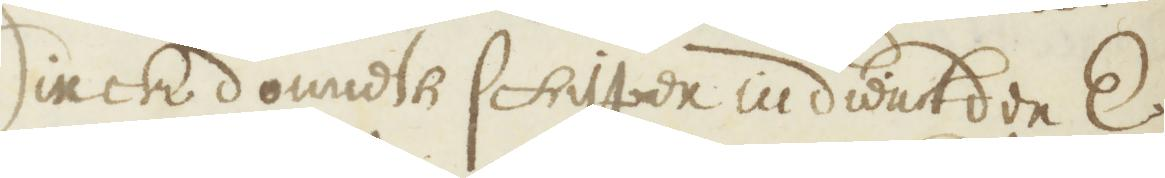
Dirck donneth schipper in dienst der E
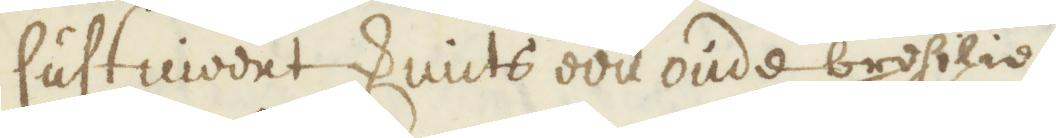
sustineert vermits een oude bresilie
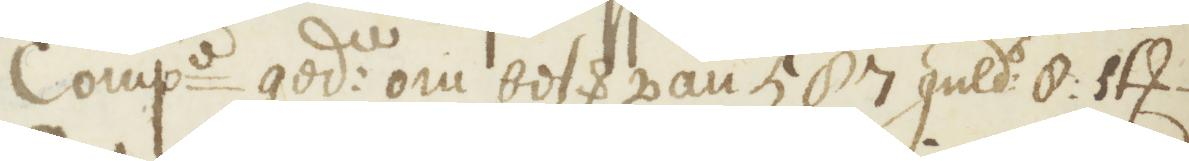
Comp=e ged:e om betver van 587 guld:s 8: stver —
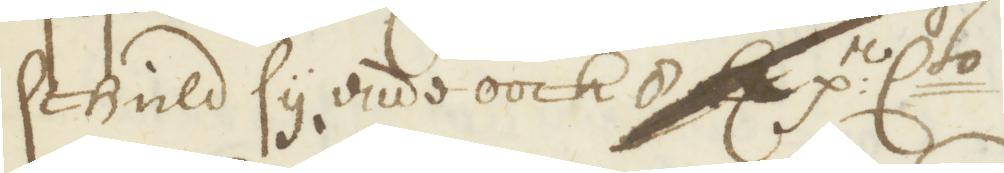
schuld sij, ende oock pr 8 p:rC=to
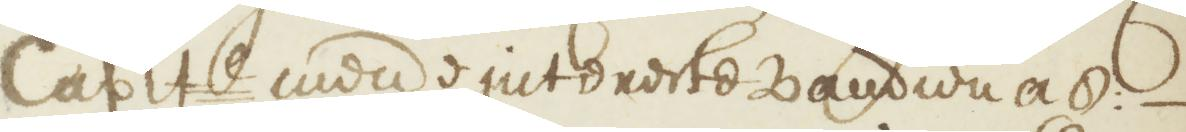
Capit=l inende jntereste vandien a 8: —
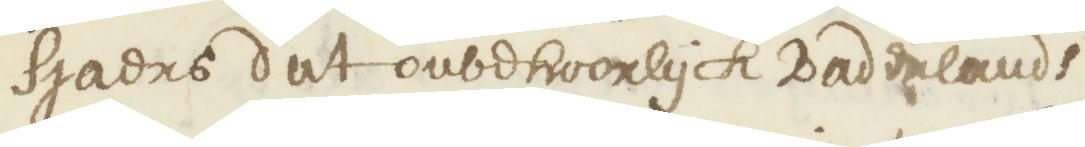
sjaers dat onbehoorlijck vaderlands
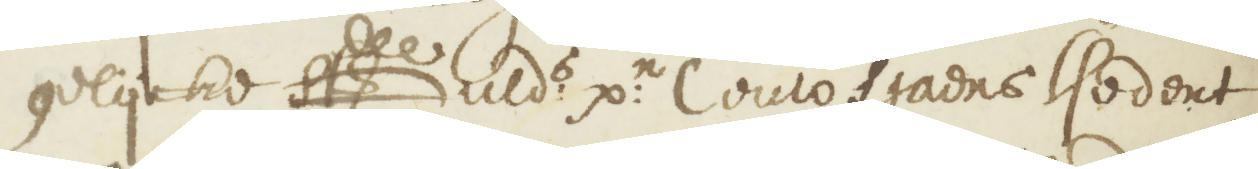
gelijcke stver uld:s p:r Cento s jaers tsedert
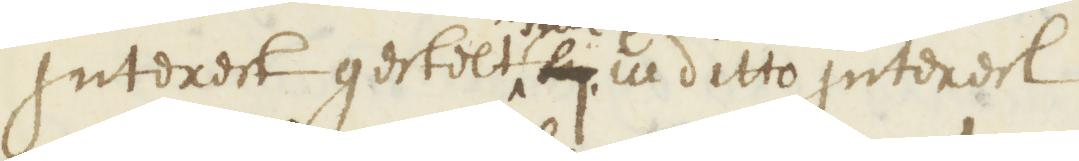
Jnterest gestelt bij in ditto jnterest
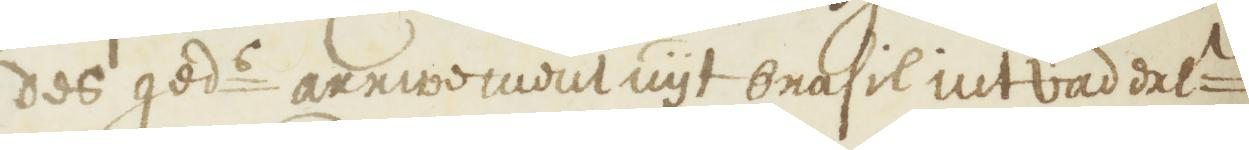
des ged=s arrivement uijt brasil int vaderl=t
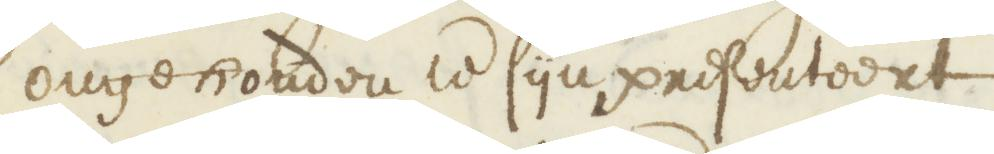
ongehouden te sijn presenteert
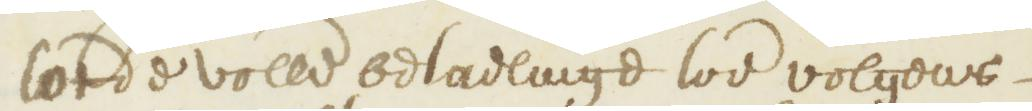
tot de volle betaelinge toe volgens
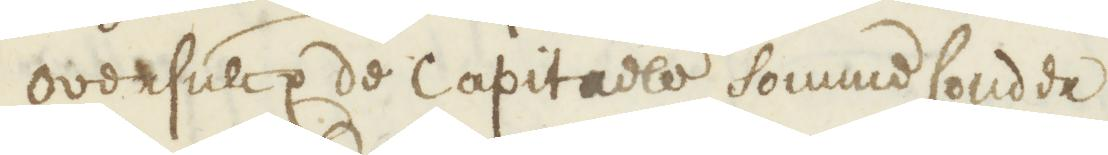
oversulcx de Capitaele somme sonder
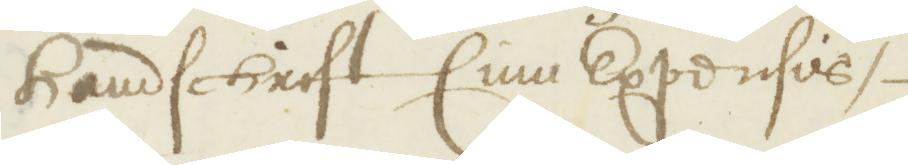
handschrift Cum Expensis / —
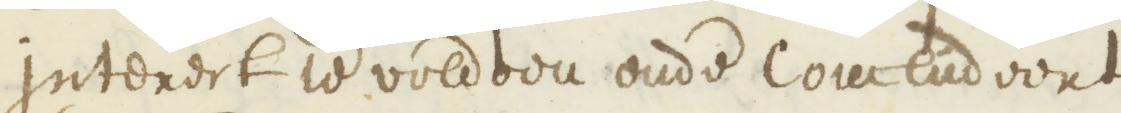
jnterest te voldoen ende Concludeert
